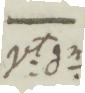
V-.t d-.m
